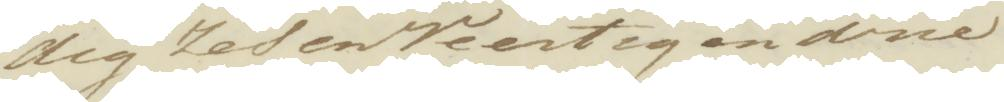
dig Zes en Veertig en drie
